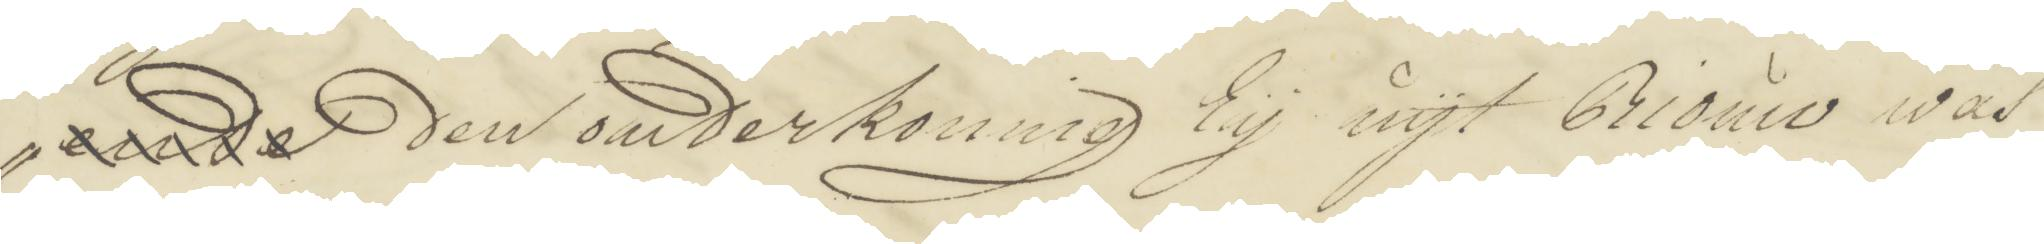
„ende den onderkoning hij uijt Riouw was
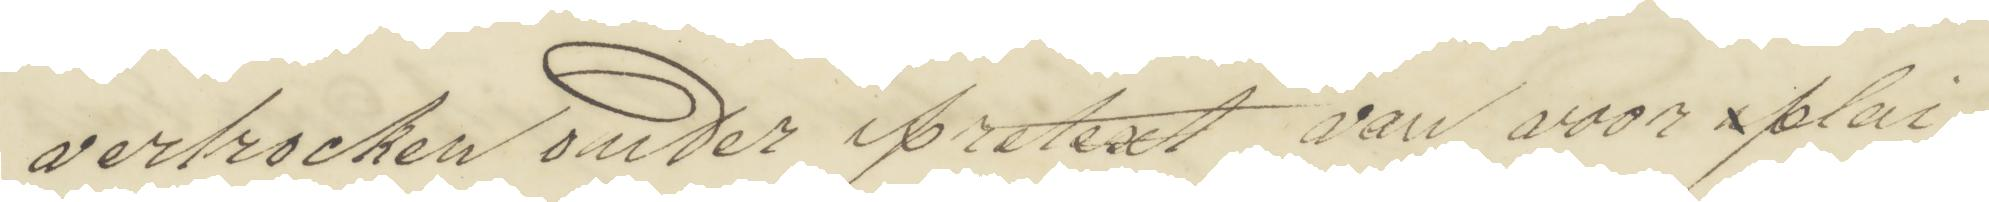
vertrocken onder pretext van voor plai
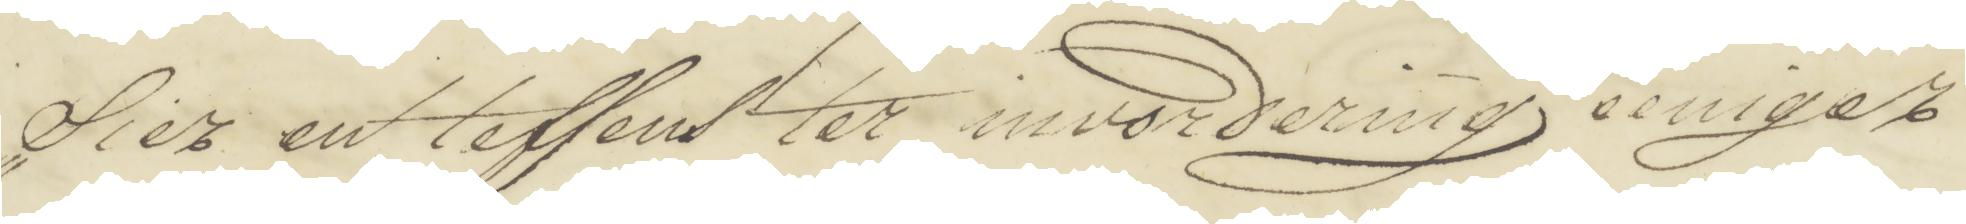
„sier en teffens ter invordering eeniger
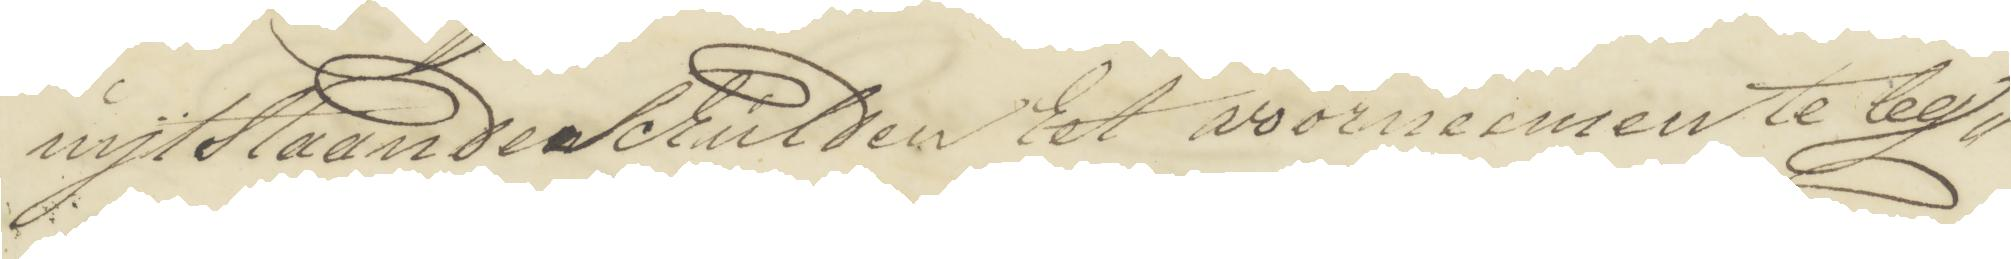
uijtstaande schulden het voorneemen te leg„
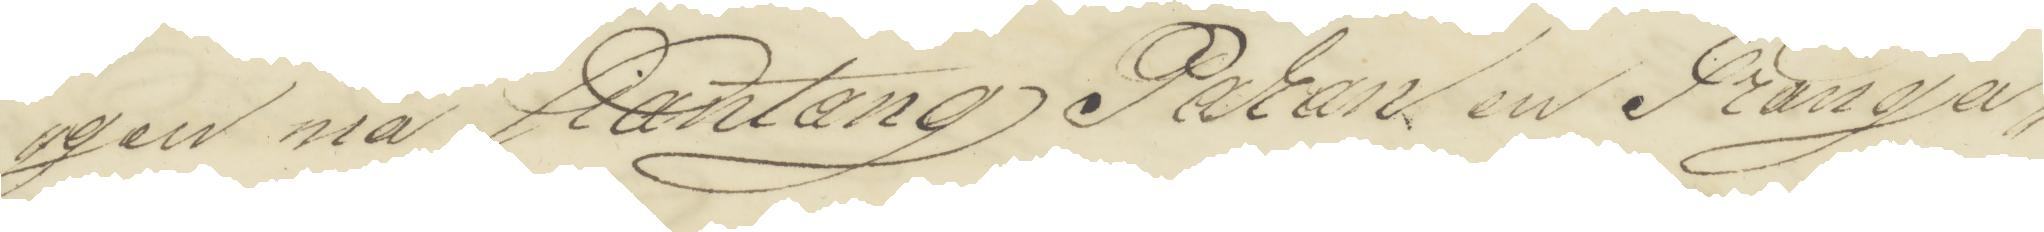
gen na Siantang Pahan en Tranga„
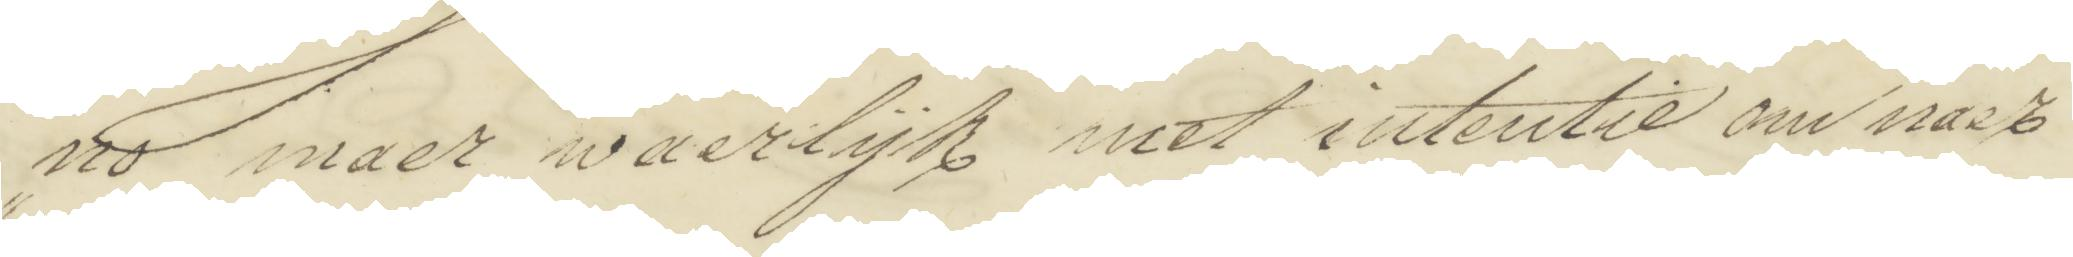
„no maer waerlijk met intentie om naer
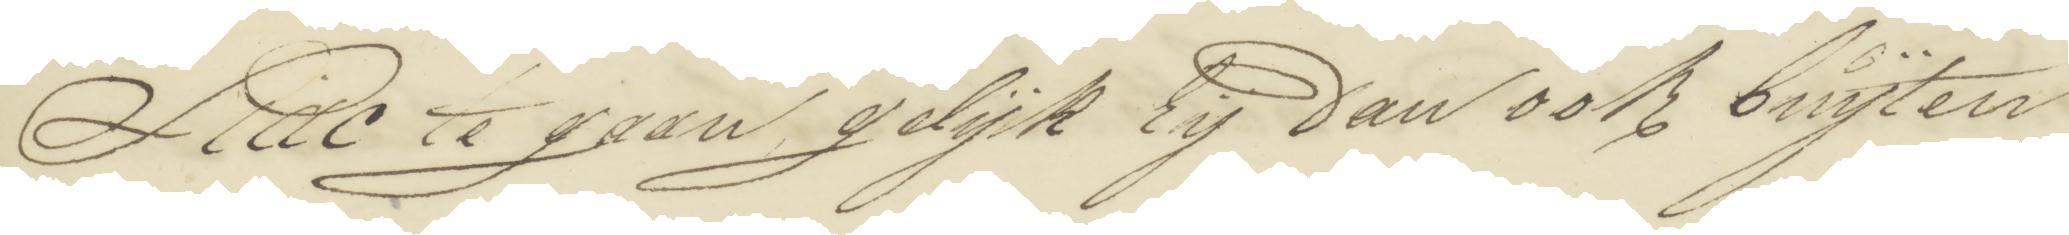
Siac te gaan gelijk hij dan ook buijten
